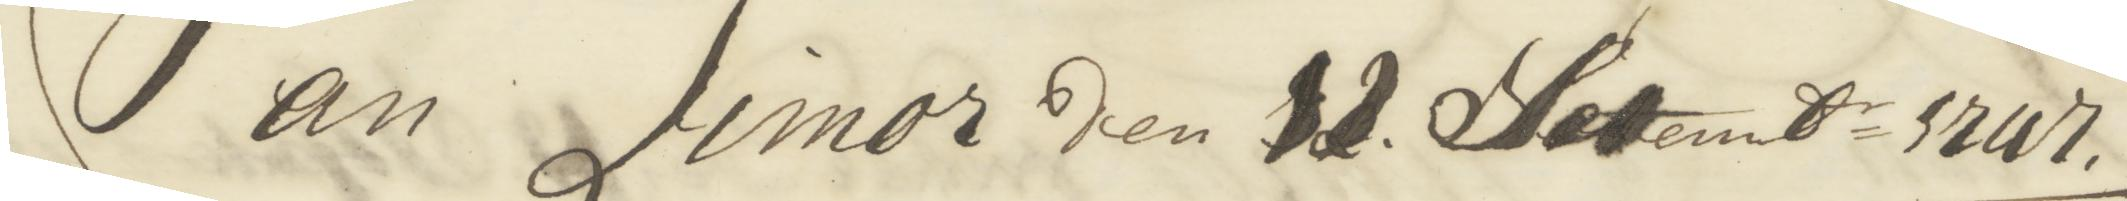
Van Timor den 12. Setemb=r 1747.
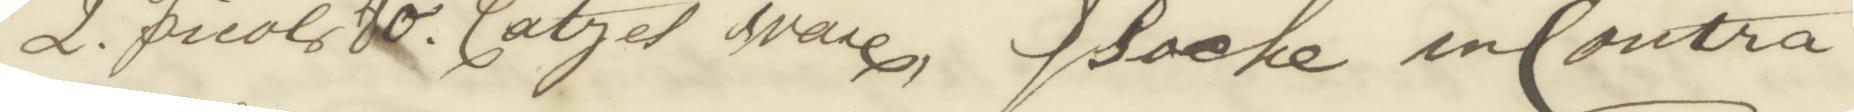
2. picols 80. Catjes wax, versoeke inContra
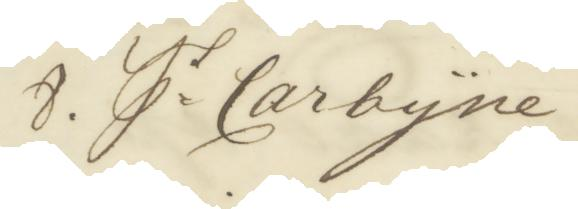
8. p=s Carbijne
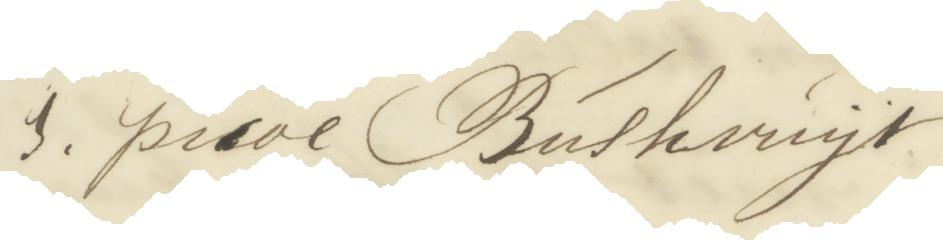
1. picol Buskruijt
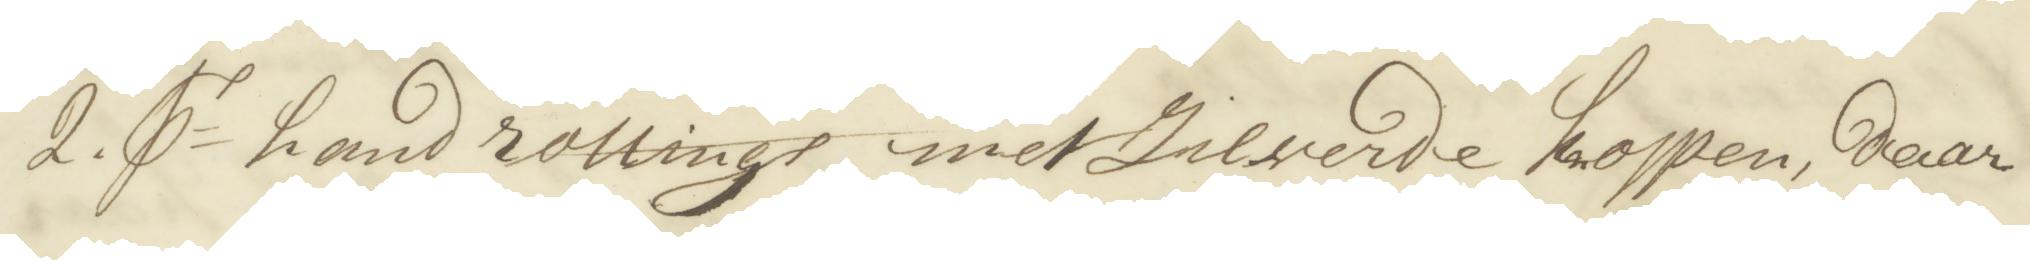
2. p=s hand rottings met zilverde koppen, daar
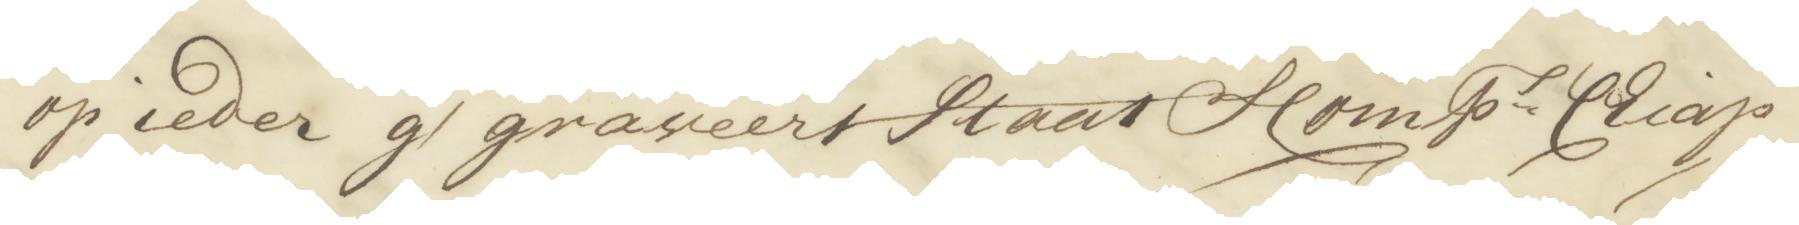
op ieder g’ graveert staat sComp=s Chiap
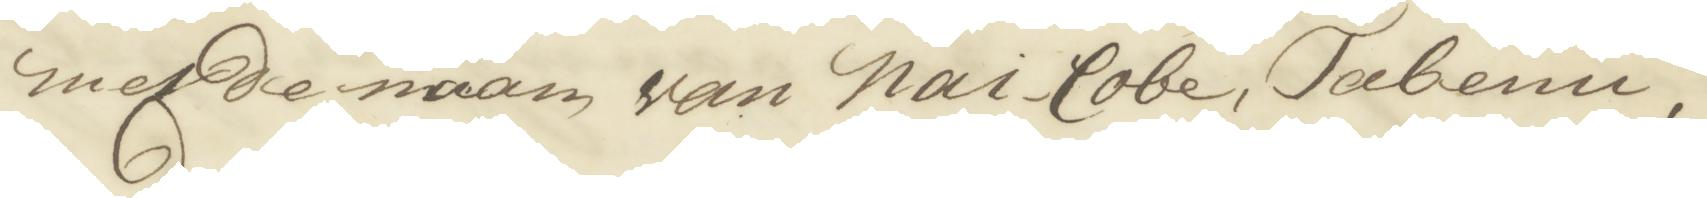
met de naam van Nai-Cobe, Tabenu,
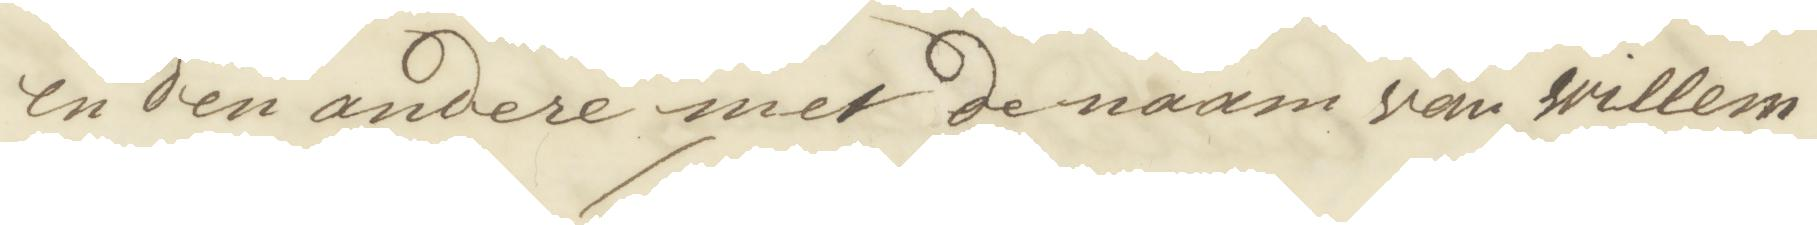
en den andere met de naam van willem
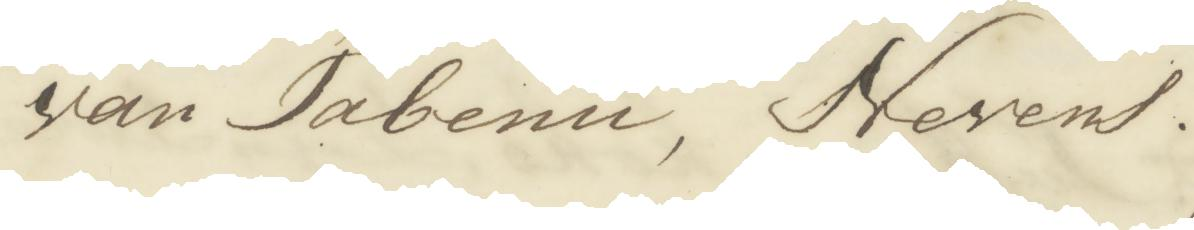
van Tabenu, Nevens.
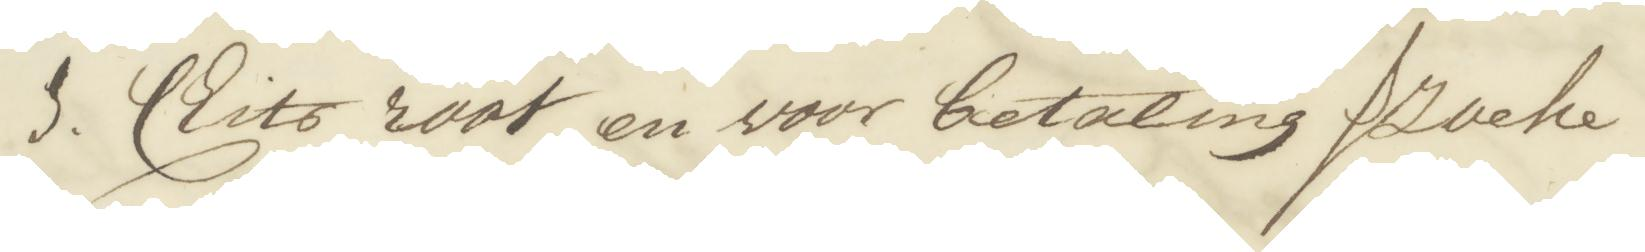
1. Chits root, en voor betaling verzoeke
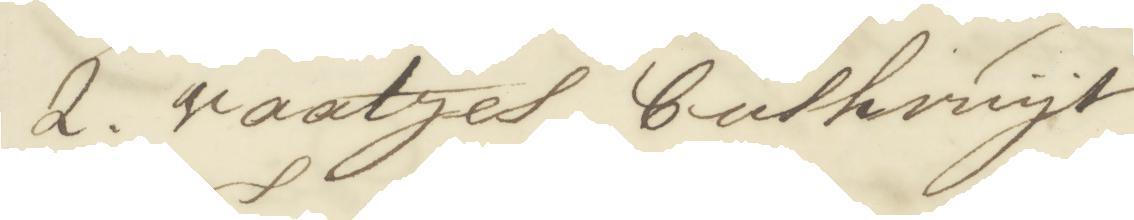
2. vaatjes buskruijt
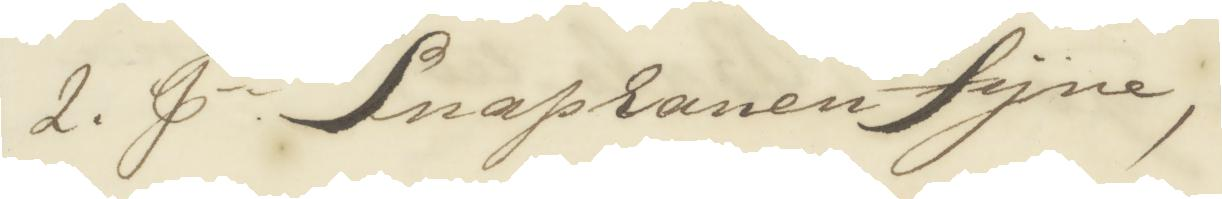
2. p:s snaphanen fijne,
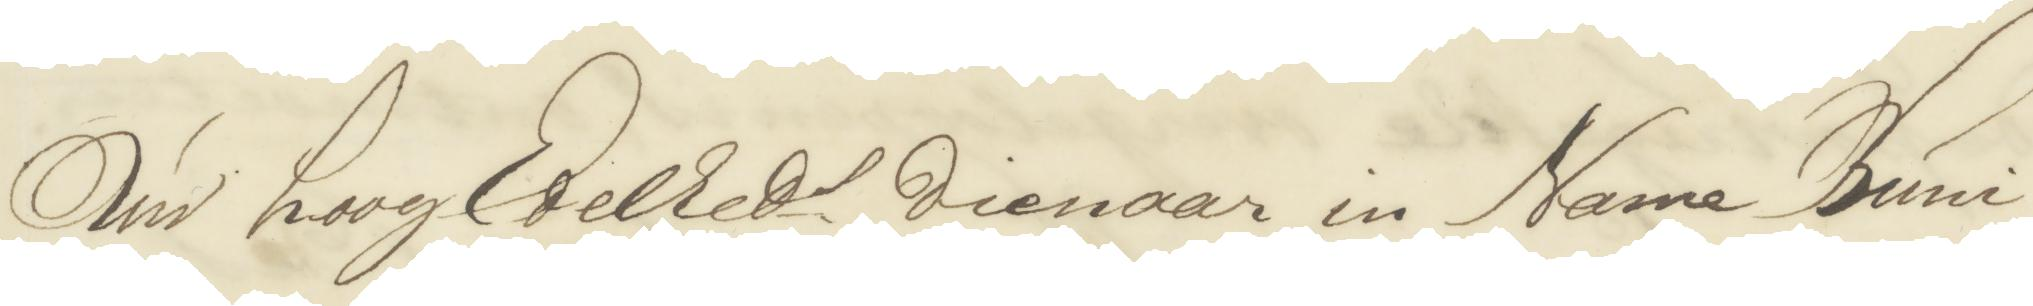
Uw hoog Edelhed=s dienaar in Name Buni
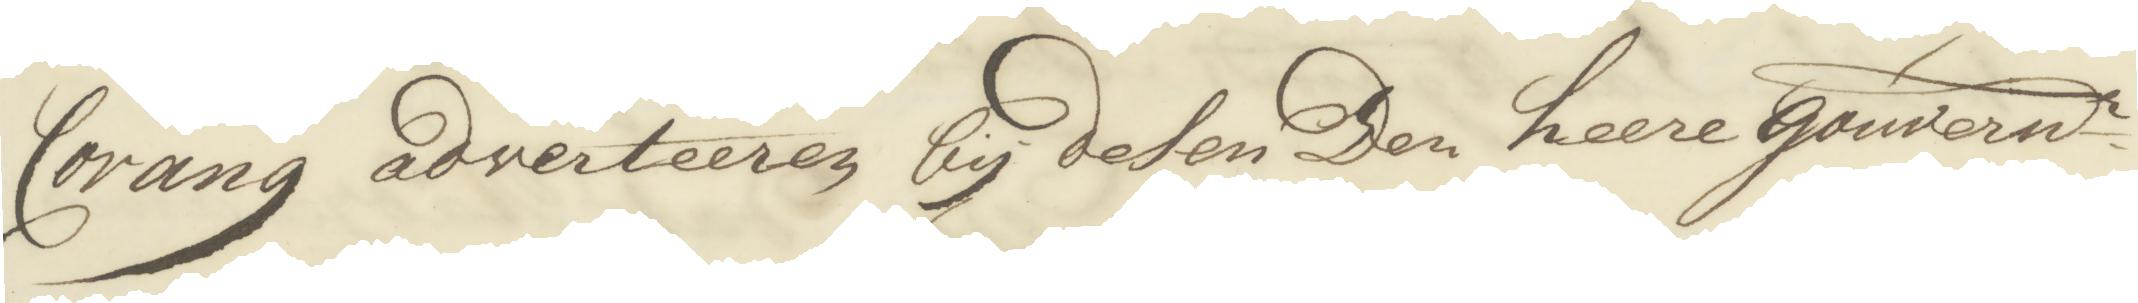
Covang adverteeren bij desen Den heere gouvern=r
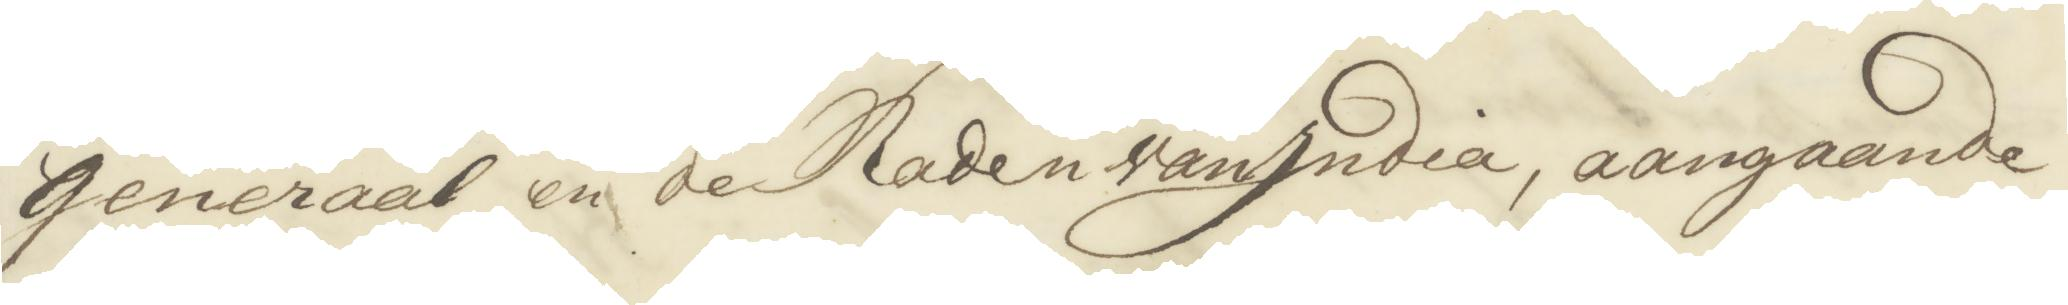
generaal en de Raden van Jndia, aangaande
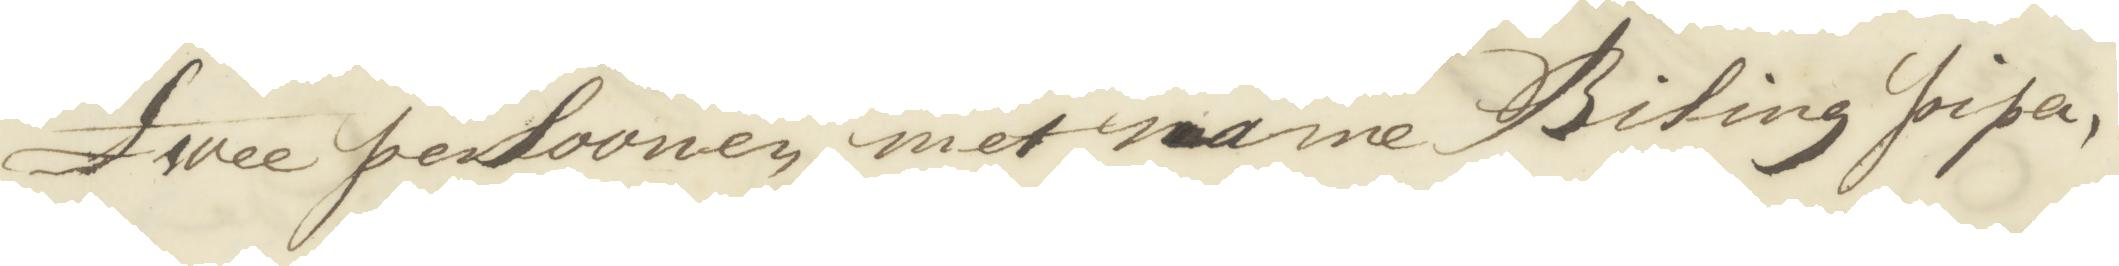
twee persoonen met name Bising pipa,
